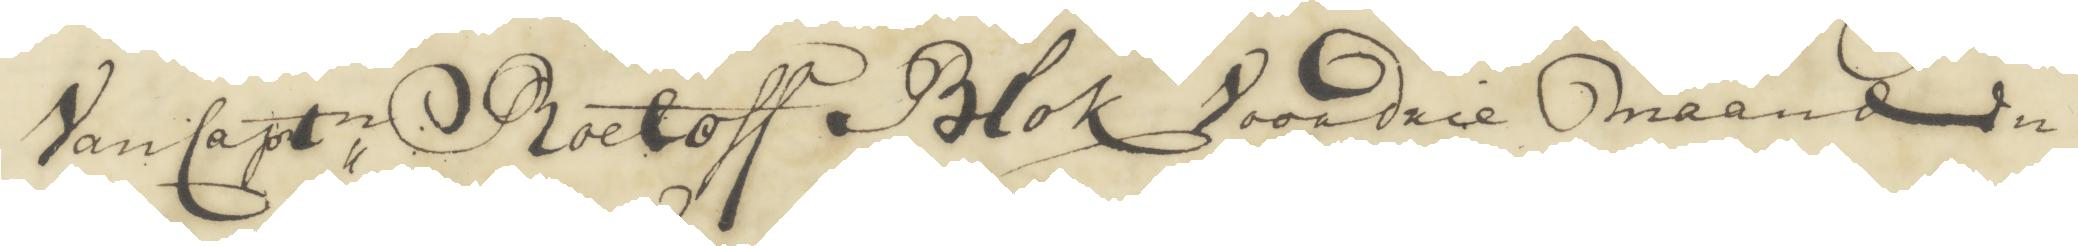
Van Capt„n Roeloff Blok voor drie maanden
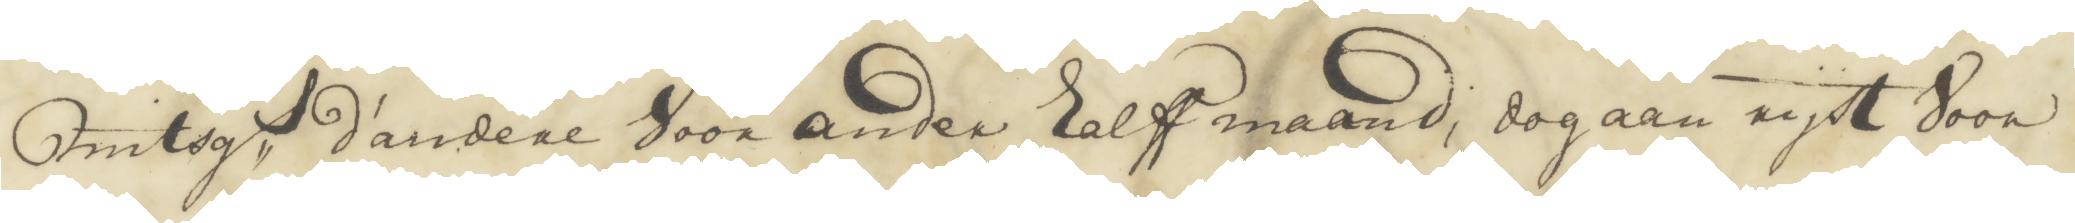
mitsg„s d'andere voor ander halff maand, dog aan rijst voor
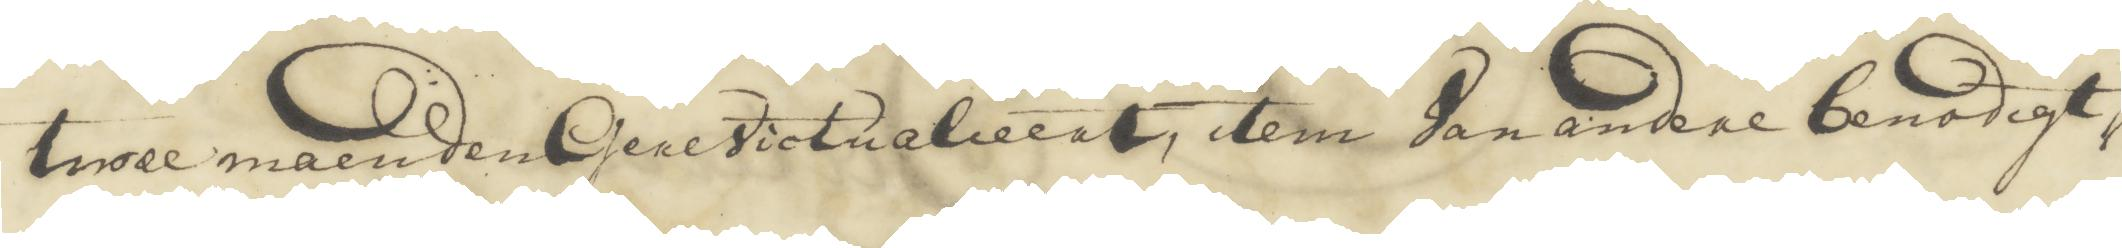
twee maenden gerevictualieert, item van andere benodigt„
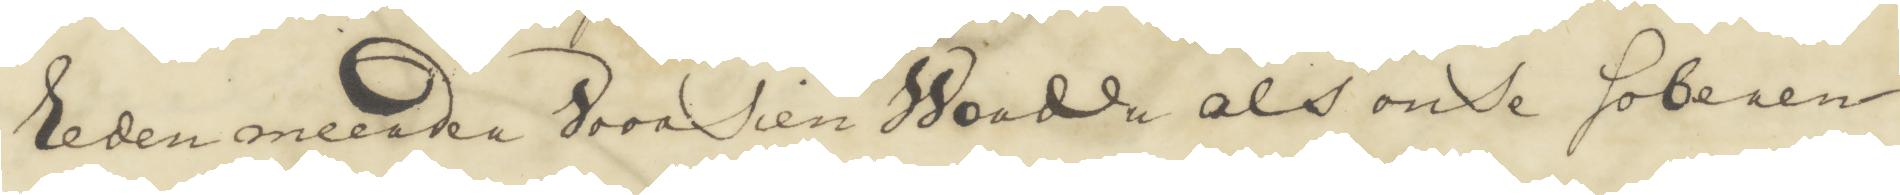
heden meerder voorsien worden als onse soberen
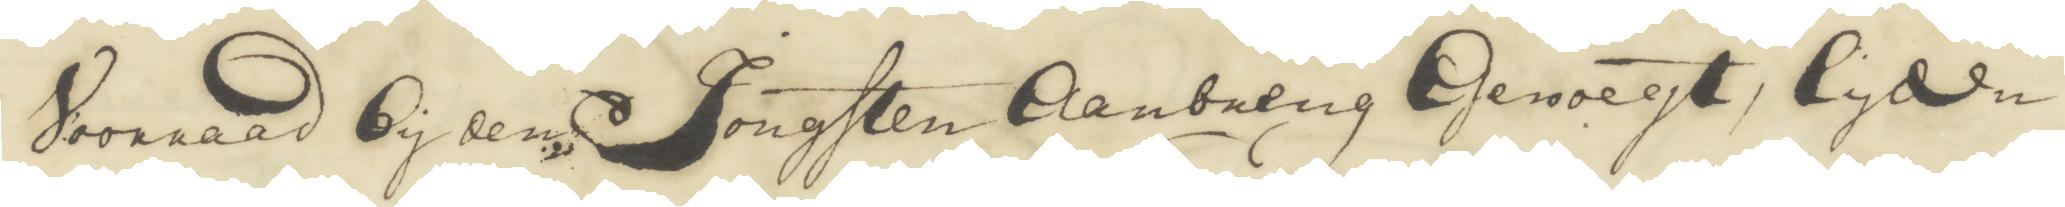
voorraad bij den Jongsten aanbreng genoegt, lijden
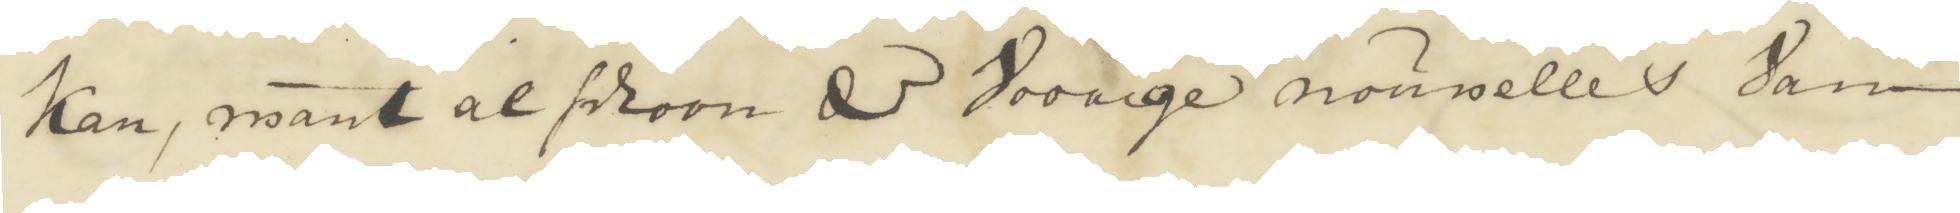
kan, want al schoon de voorige nouvelles van
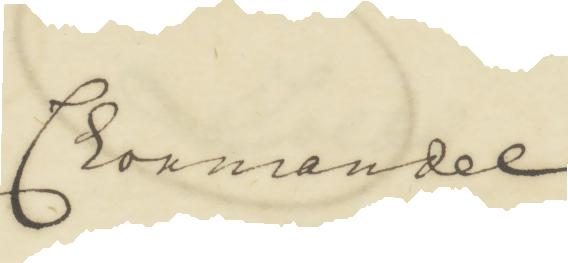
Chormandel
